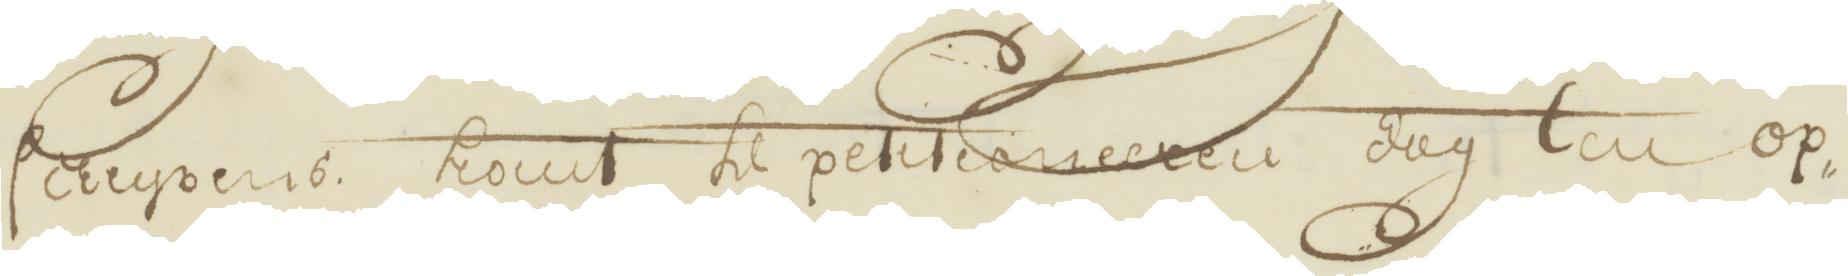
schryvens. komt te petitioneeren dog ten op„
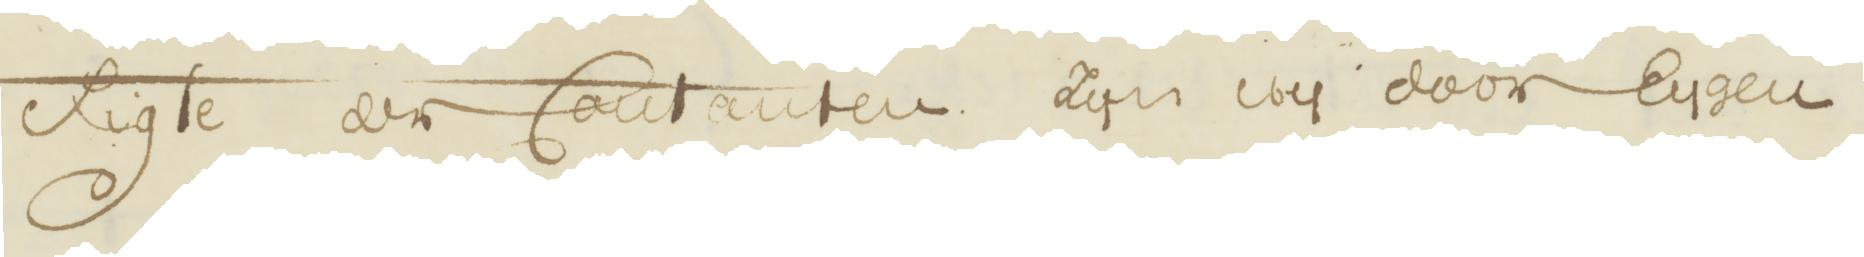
sigte der Contanten. zyn wy door Eygen
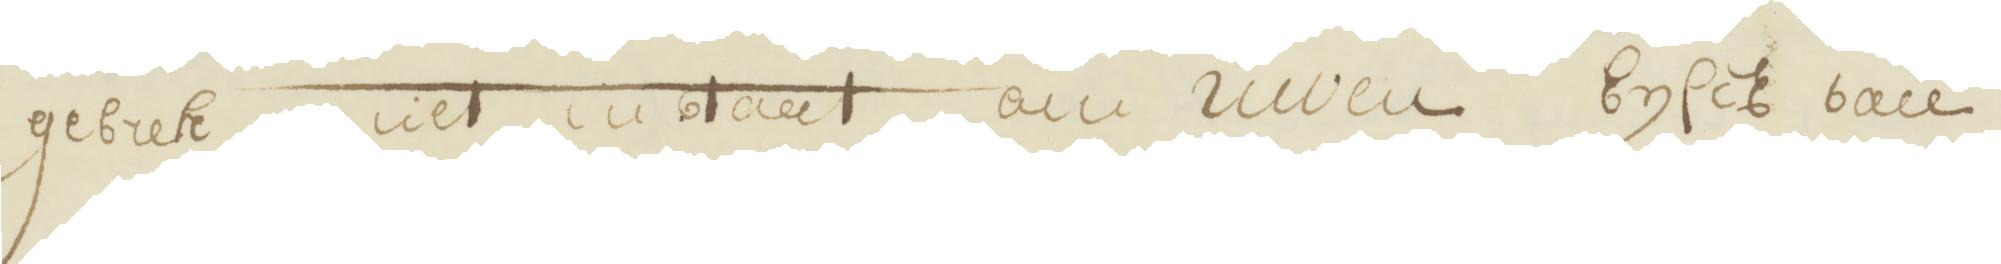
gebrek niet in staat om uwen Eijsch van
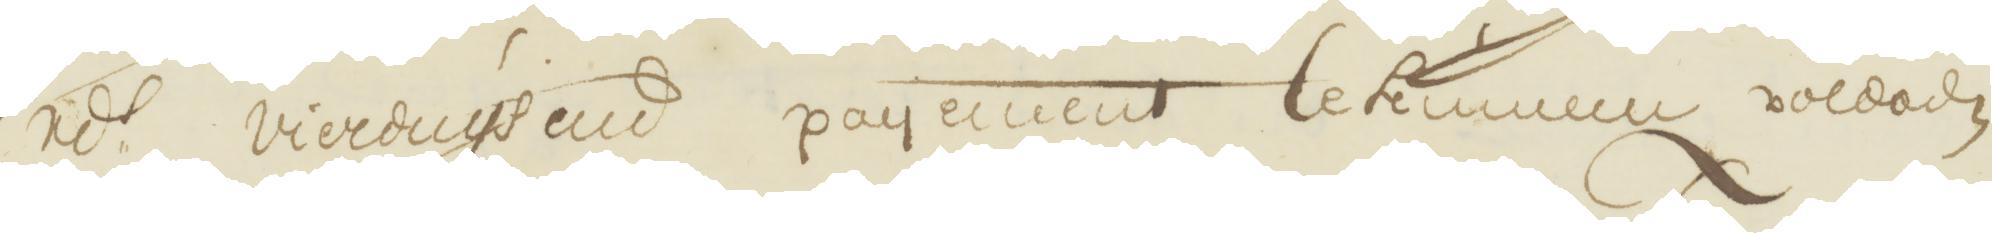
rd„s vierduijsend paijement te kunnen voldoen
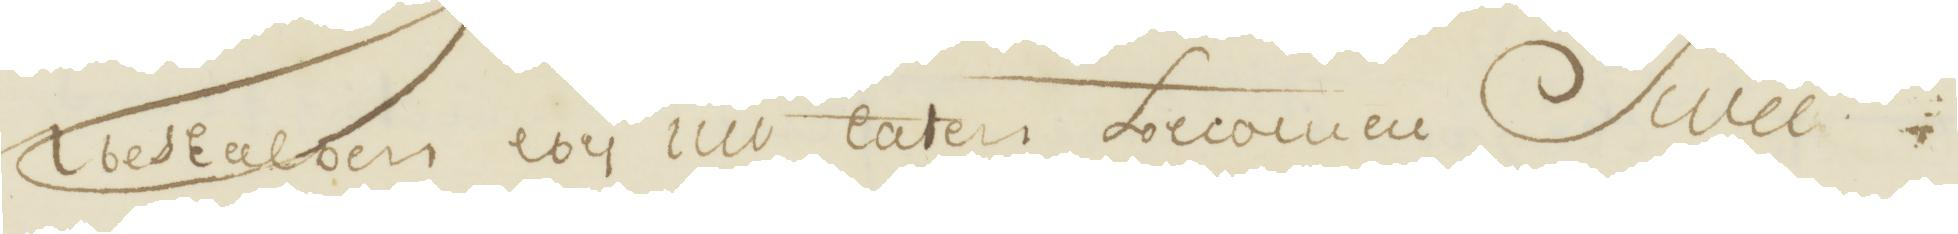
weshalven wy uw laten toecomen Twee:
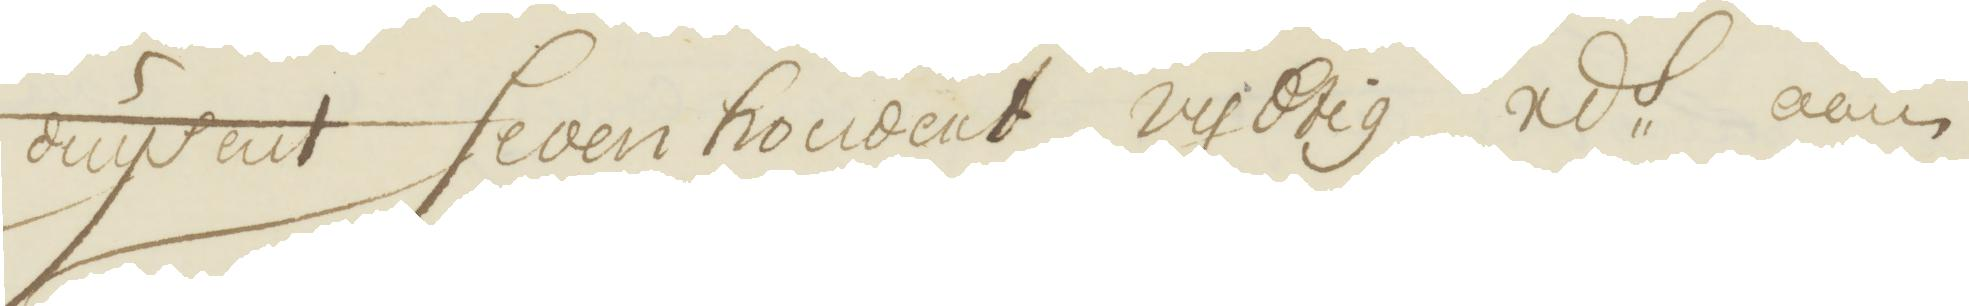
duijsent sevenhondert vyftig rd:s aan
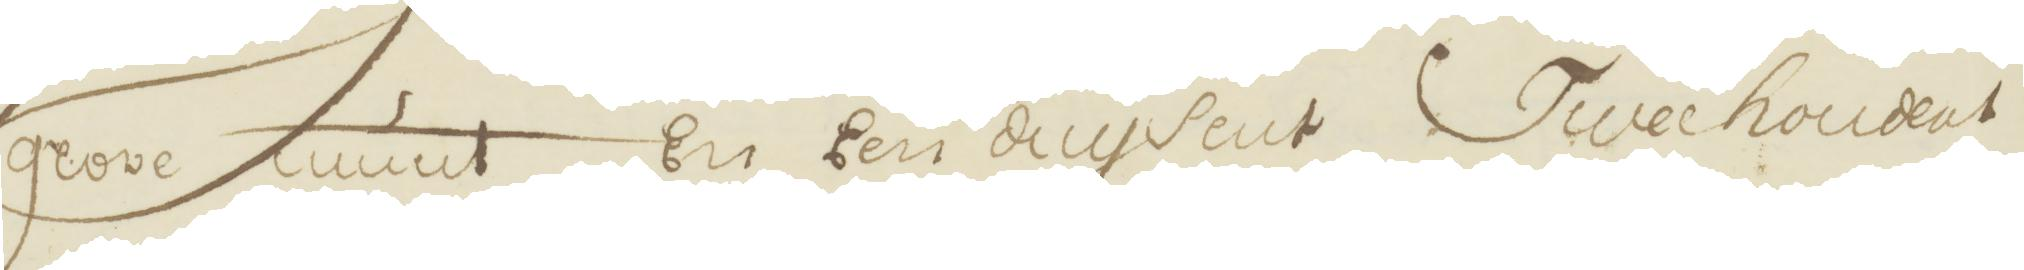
grove munt En Een duijsent Tweehondert
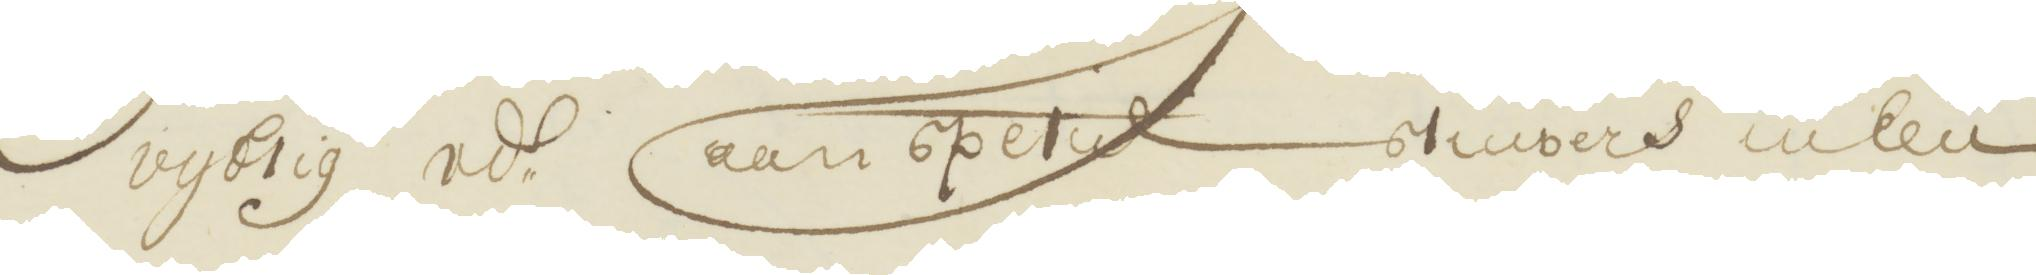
vyftig rd:s aan spetie stuivers in Een
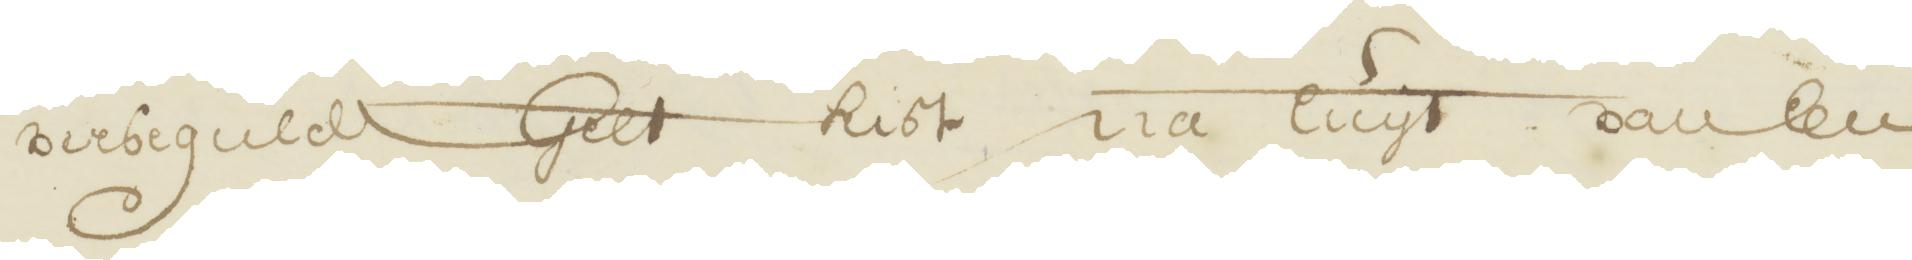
versegulde Gelt kist na luijt van Een
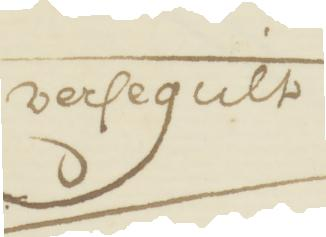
versegult
